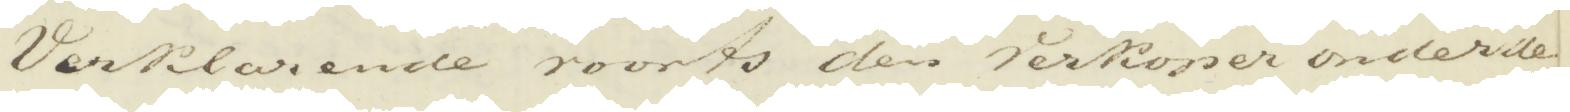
Verklarende voorts den Verkoper onder de
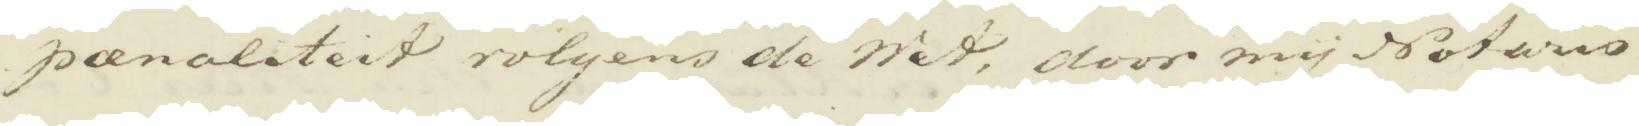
paenaliteit volgens de Wet, door mij Notaris
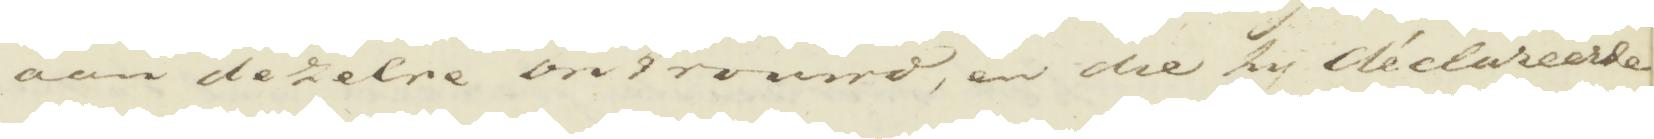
aan dezelve ontvouwd, en die hij declareerde
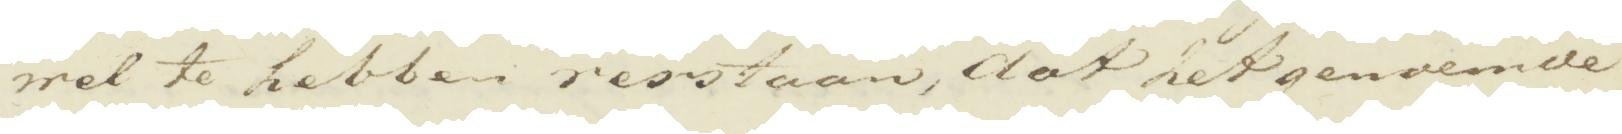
wel te hebben verstaan, dat het genoemde
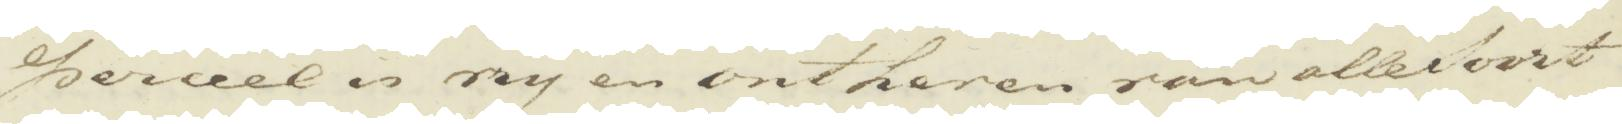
perceel is vry en ontheven van allesoort
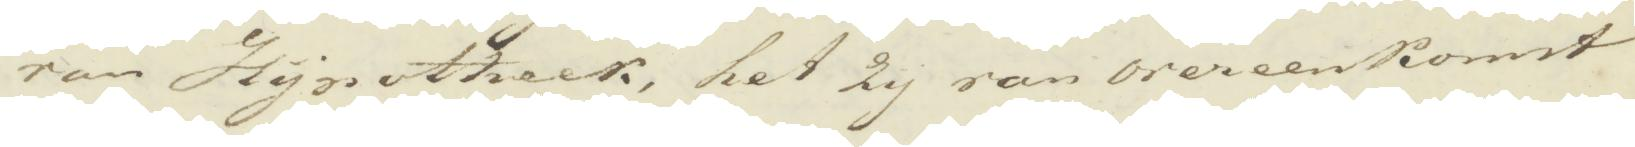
van Hijpotheek, het zij van overeenkomst
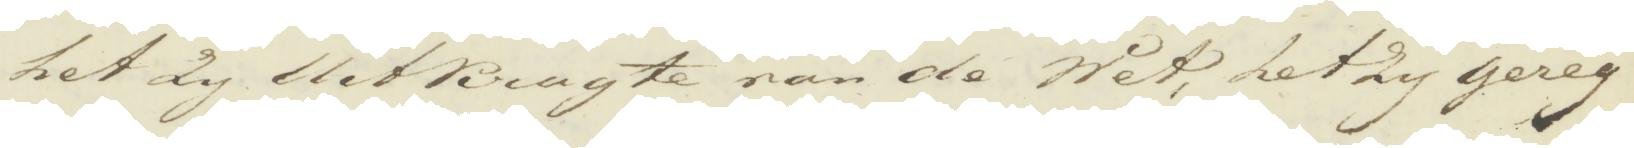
het zy Uit kragte van de Wet, het zy gereg
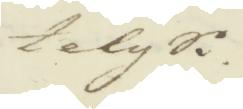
telijk.
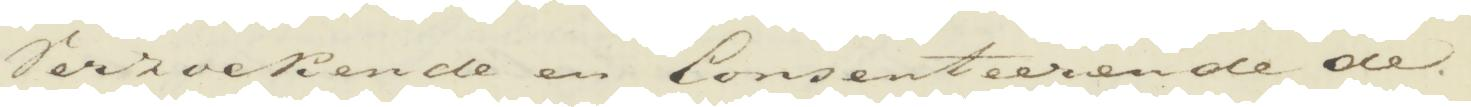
Verzoekende en Consenteerende de
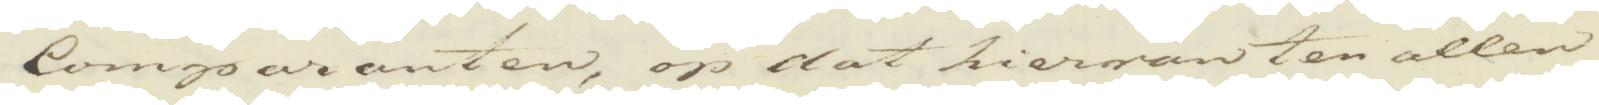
Comparanten, op dat hiervan ten allen
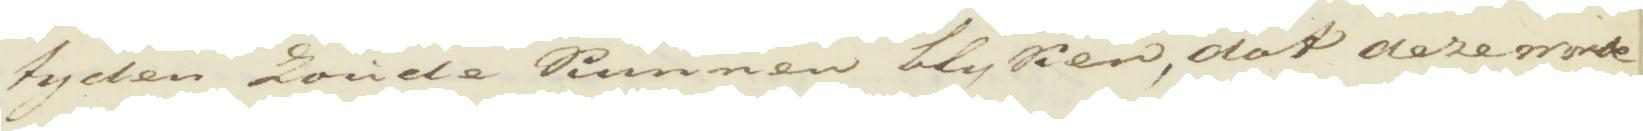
tyden zoude kunnen blyken, dat deze worde
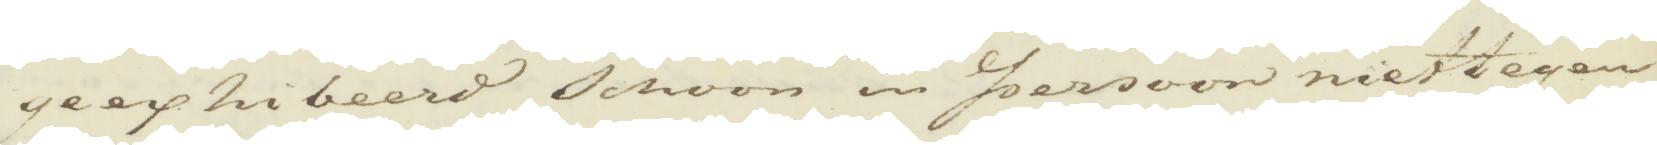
geexhibeerd schoon in Persoon niettegen
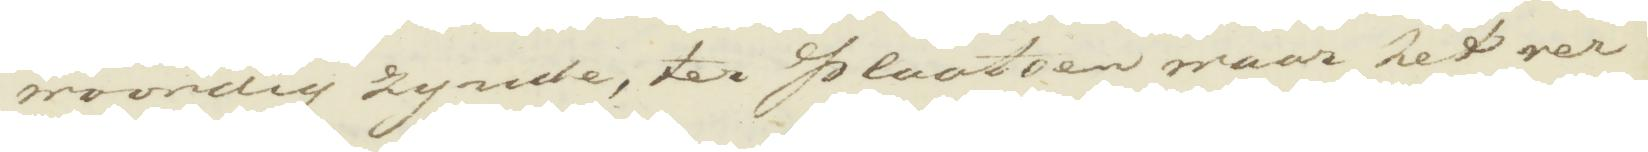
woordig zynde, ter Plaatsen waar het ver
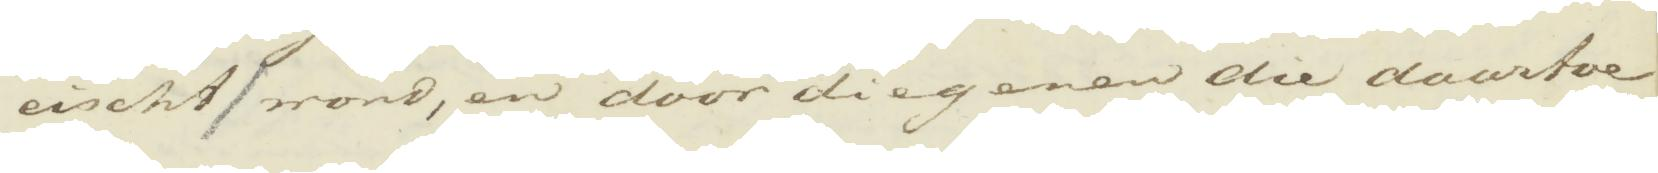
eischt word, en door diegenen die daartoe
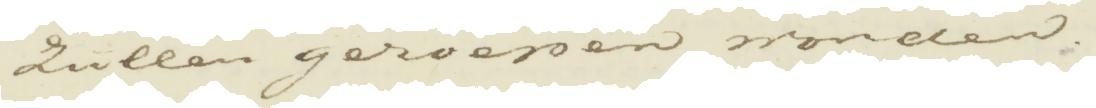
zullen geroepen wonden.
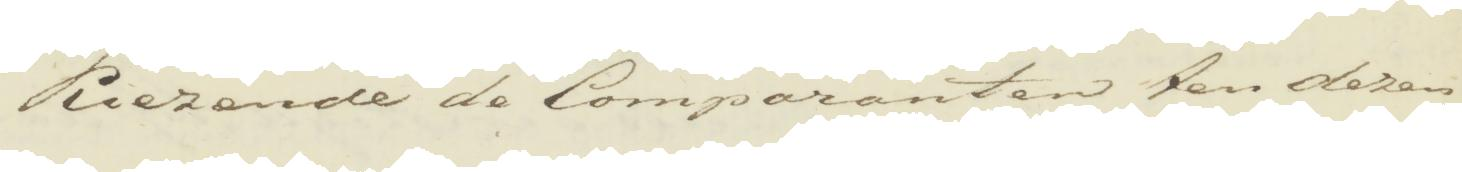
Kiezende de Comparanten ten dezen
